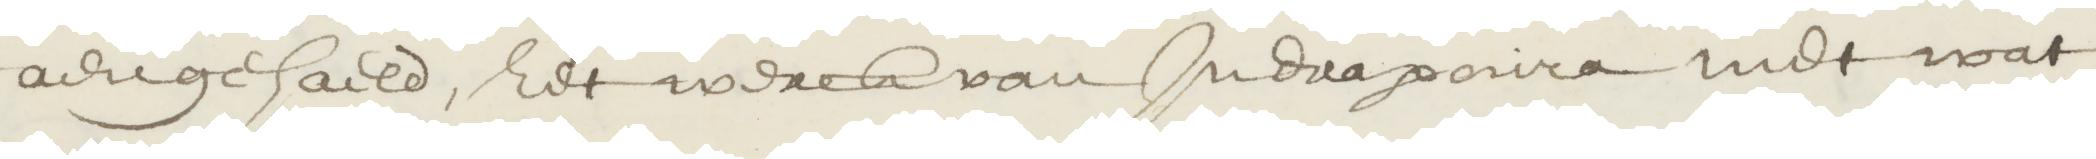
aengehaeld, het werck van Indrapaura met wat
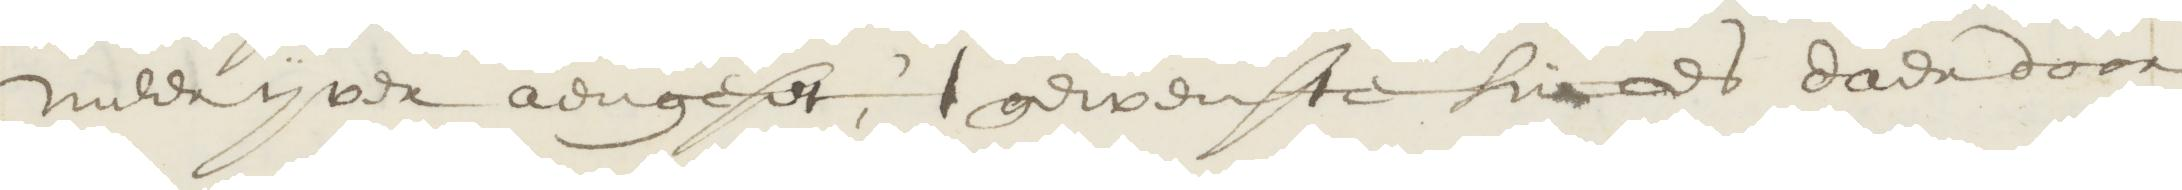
meer ijver aengeset, ’t gewenste hies daer door
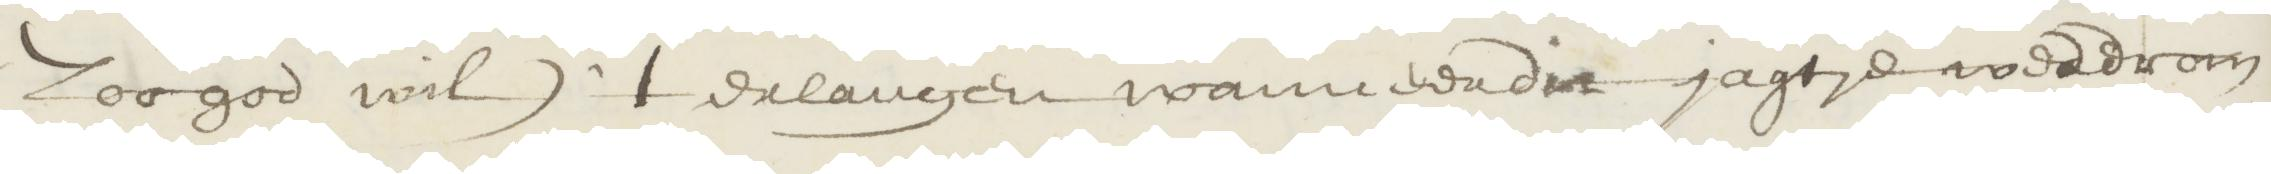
(Zoo god wil) ’t erlangen wanneer dit jagtje wederom
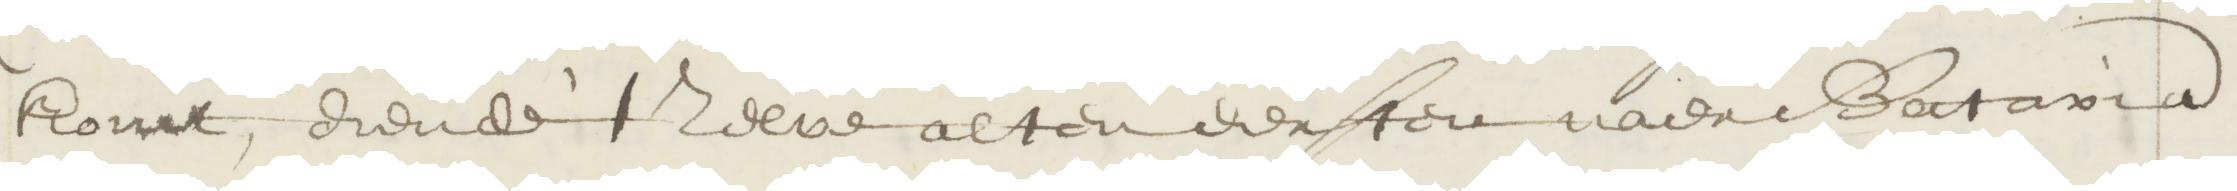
komt, diende ’t Zelve alten eersten naer Batavia
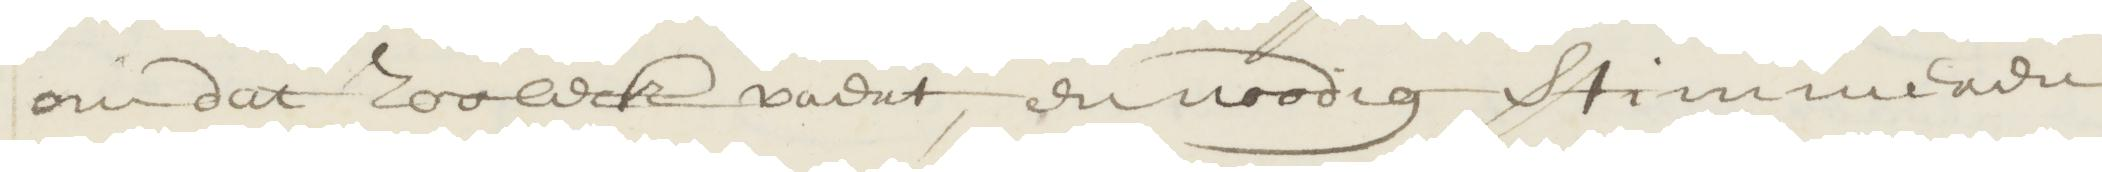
om dat Zooleck vaert, en noodig vertimmeren
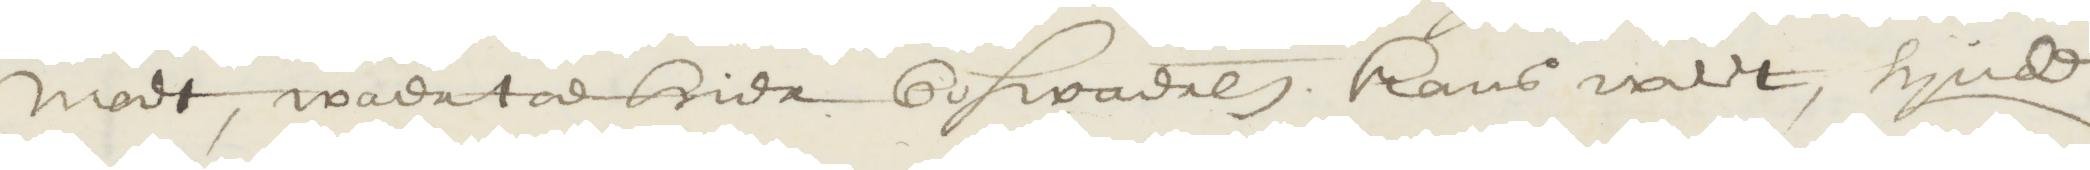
moet, waertoe hier byswaerlijk kans weet, synde
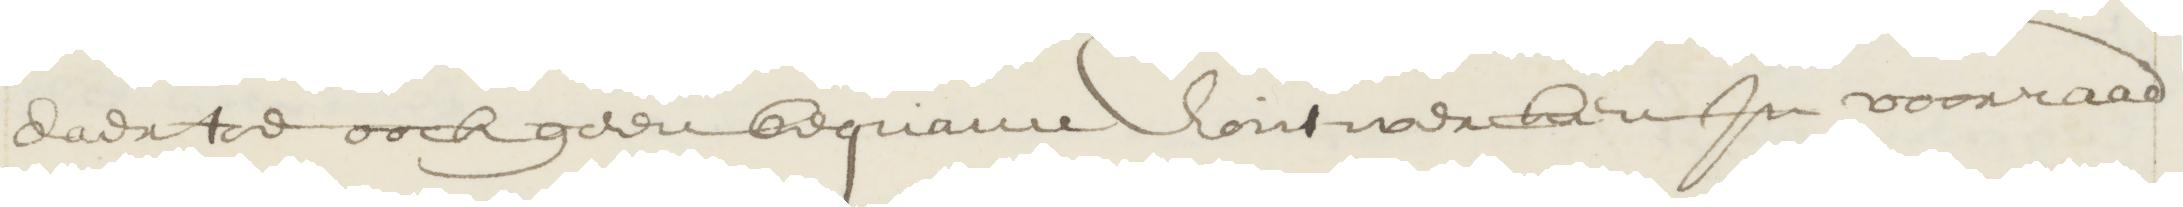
daertoe oock geen bequame houtwercken jn voorraad
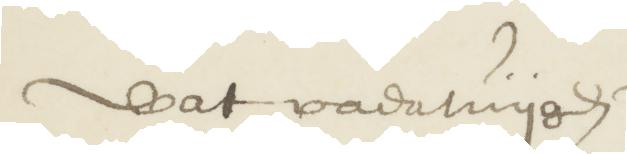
wat vaertuijgen
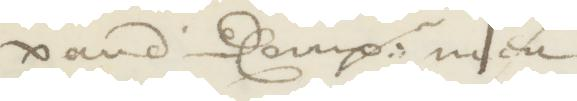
van d’ Comp:e meer
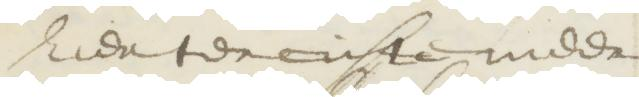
hier ter custe meer
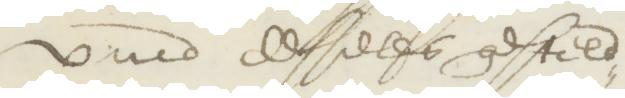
vind desselfs gesteld„
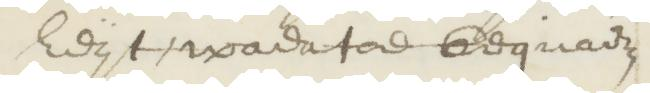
heijt, waertoe bequaem
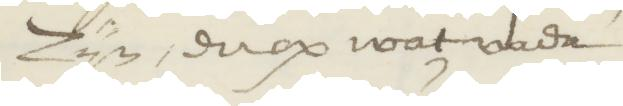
Zijn, en op wat waer
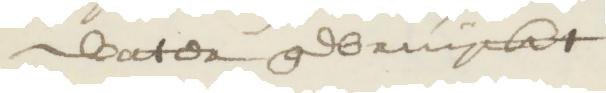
water gebruijckt
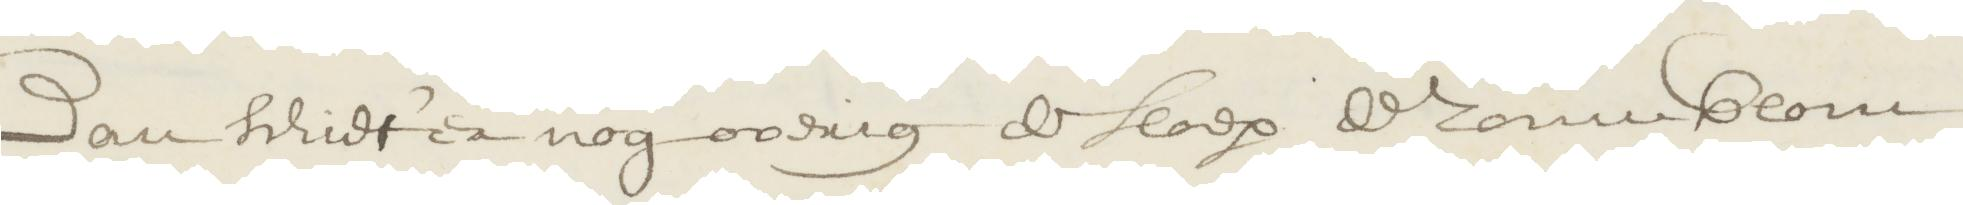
Dan schiet' er nog overig de sloep de Zonneblom
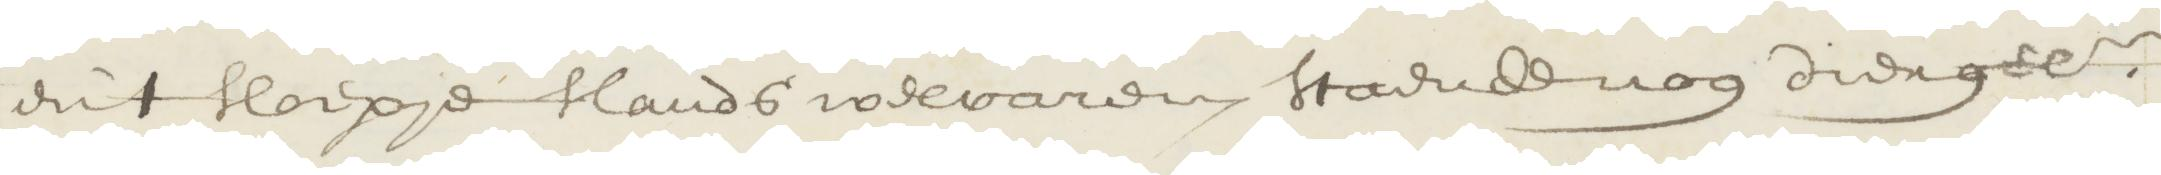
en ’t sloepje 'tlands welvaren, staende nog diergel.n
